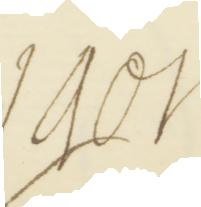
1401
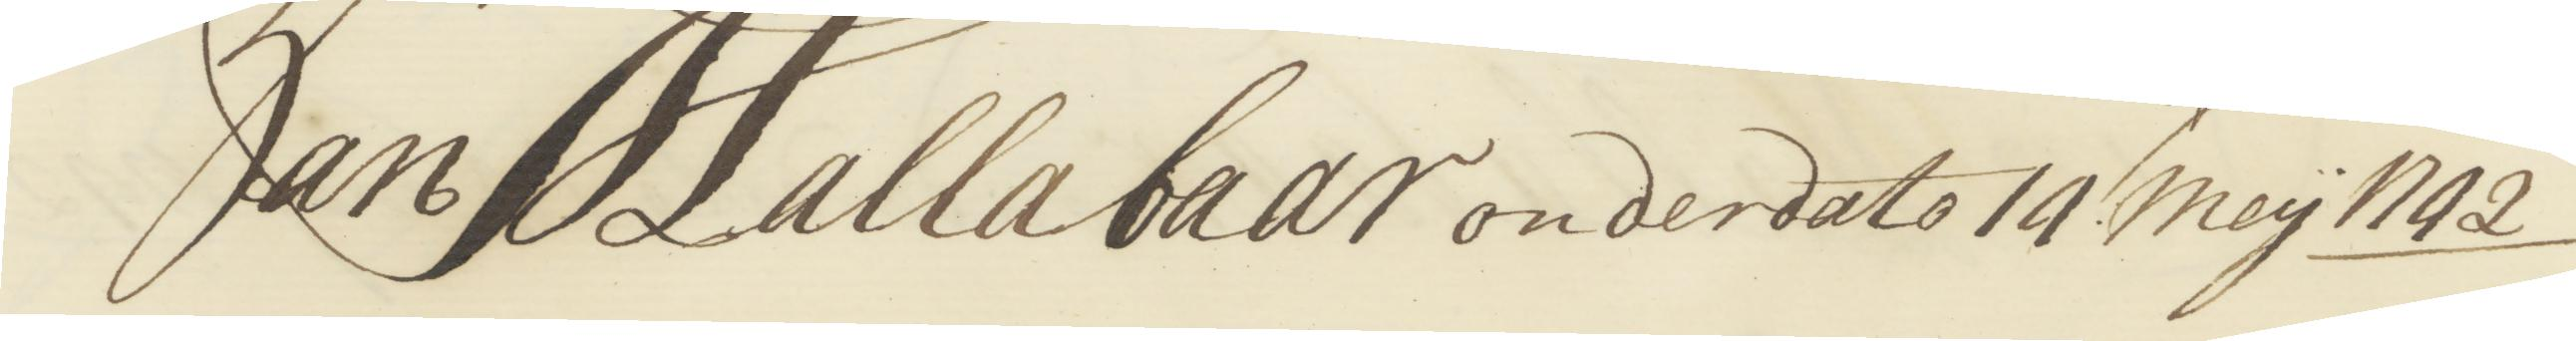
Van Mallabaar onderdato 14' meij 1742
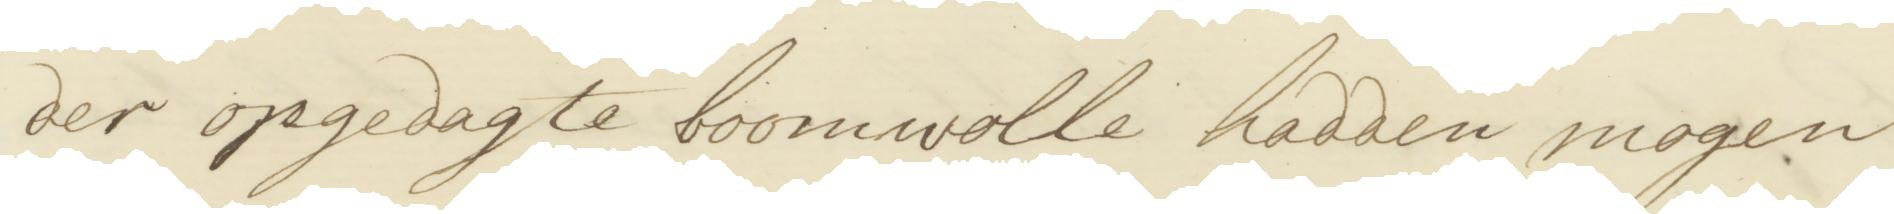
der opgedagte boomwolle hadden mogen
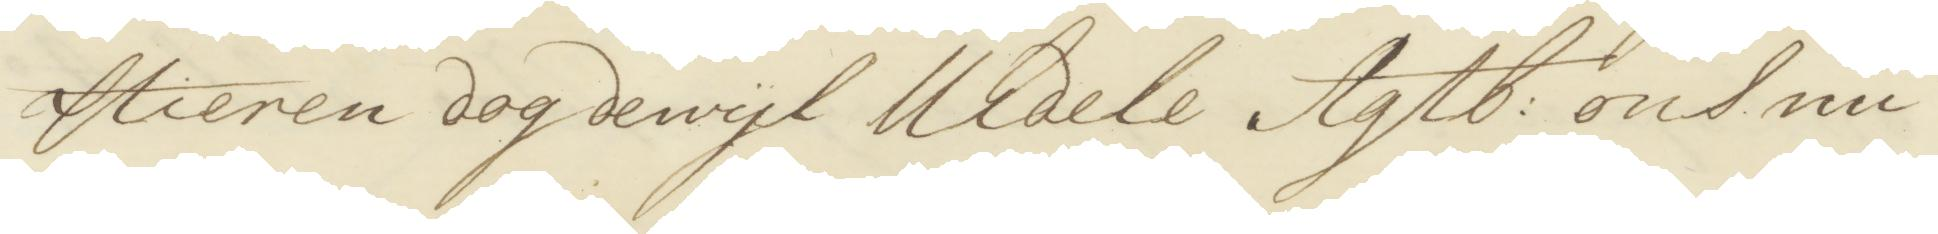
vertieren dog dewijl UEdele Agtb: ons nu
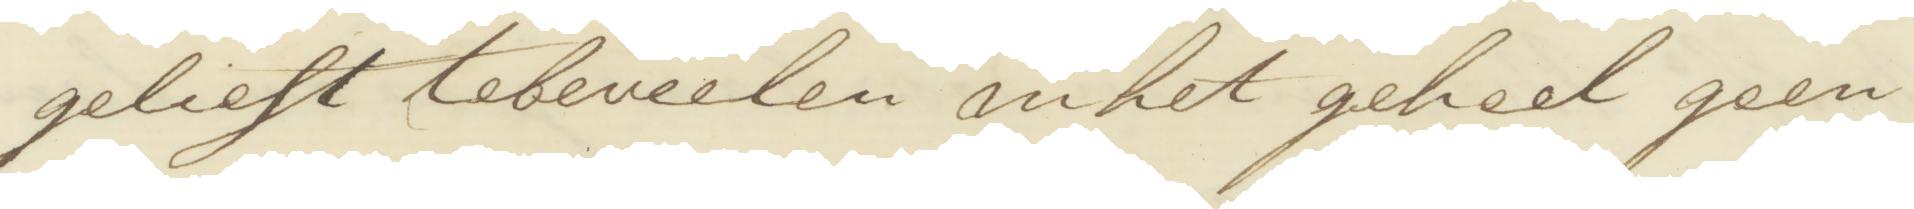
gelieft tebeveelen in het geheel geen
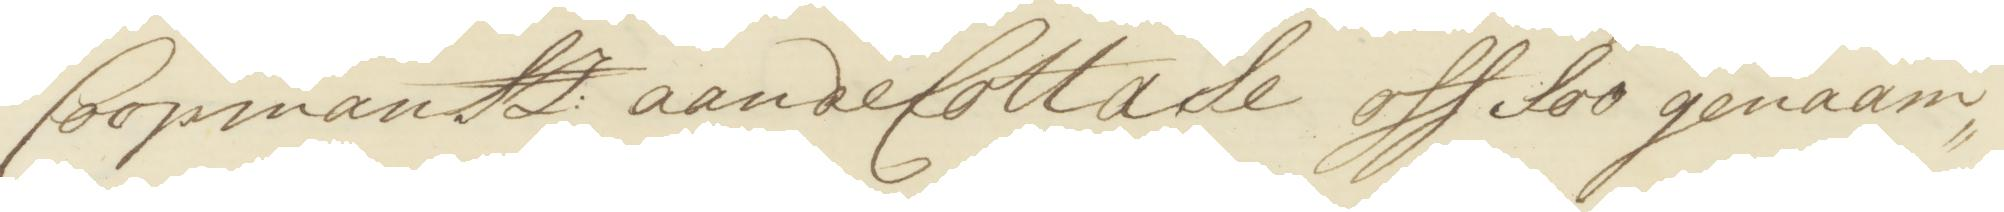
Coopmansz: aan deCottase off soo genaam„
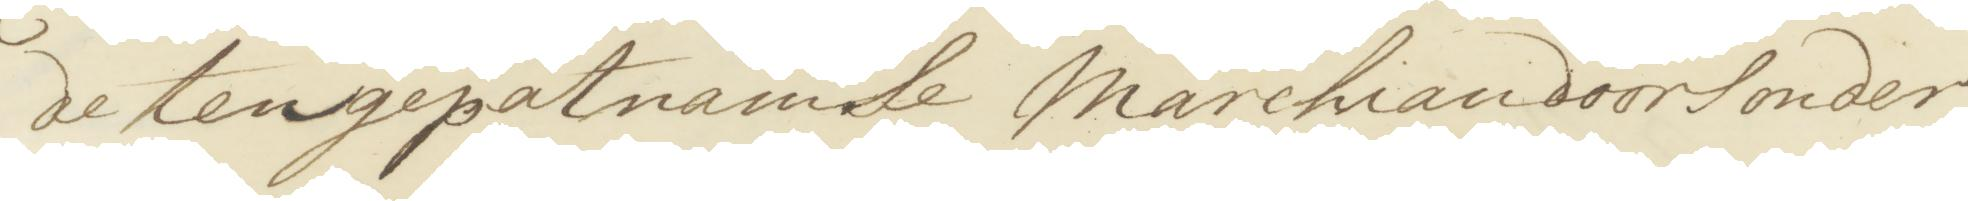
de tengepatnamse Marchiandoors onder
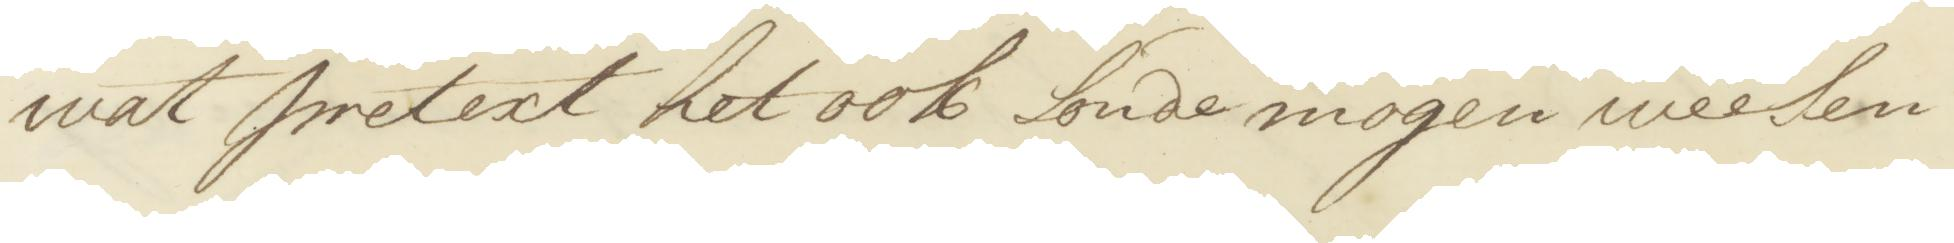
wat pretext het ook soude mogen weesen
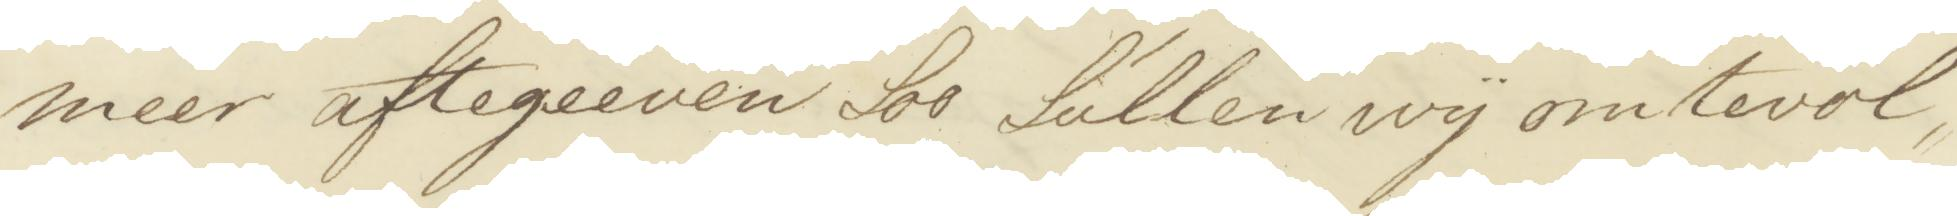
meer aftegeeven soo sullen wij om tevol„
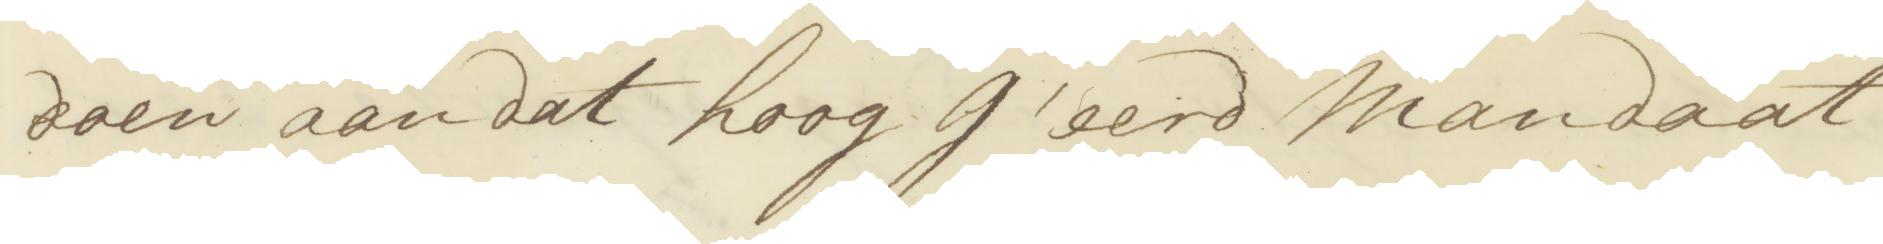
doen aan dat hoog g’eerd mandaat
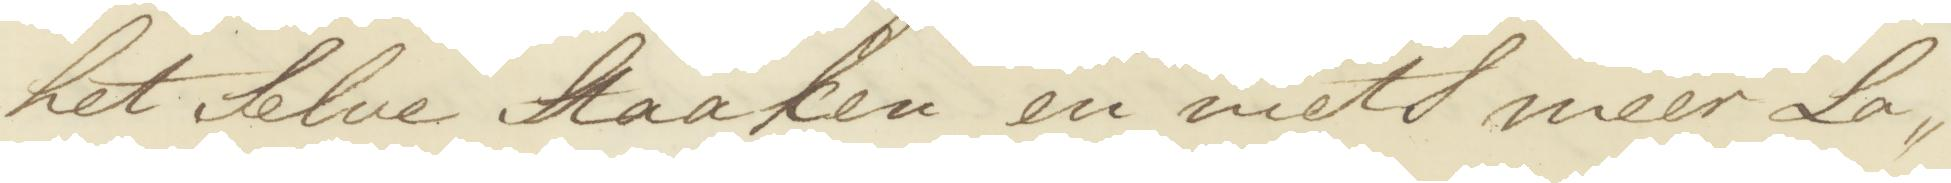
het selve staaken en niets meer La„
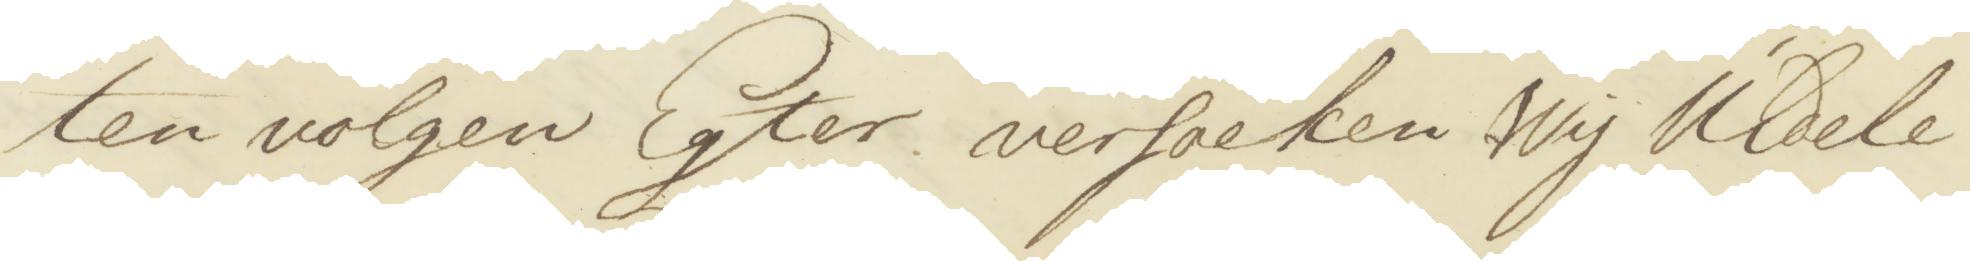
ten volgen Egter versoeken wij UEdele
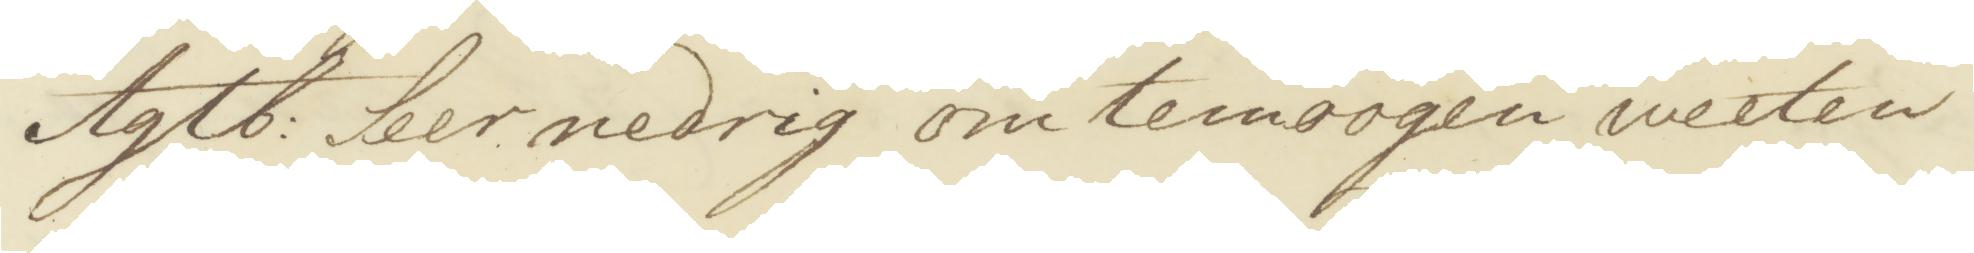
Agtb: seer nedrig om temoogen weeten
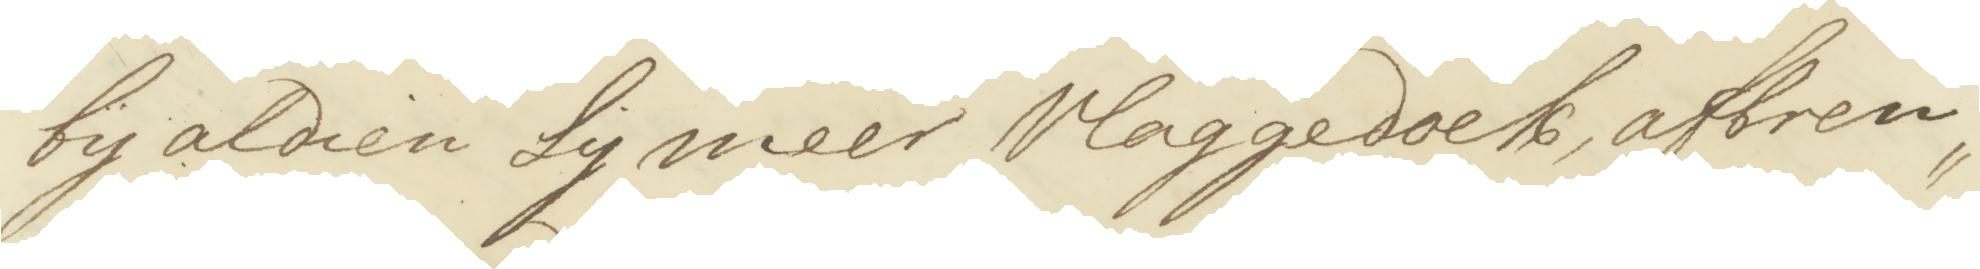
bij aldien sij meer vlaggedoek, afbren„
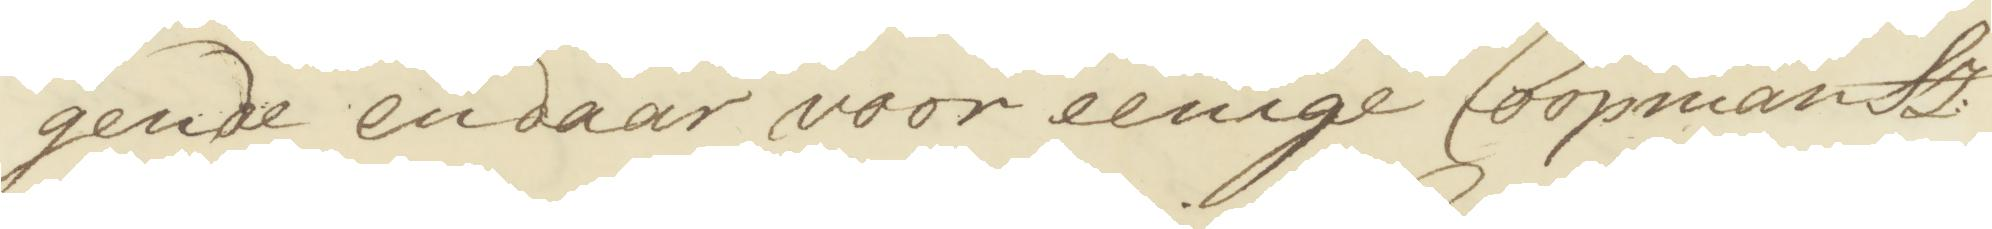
gende en daar voor eenige Coopmansz:
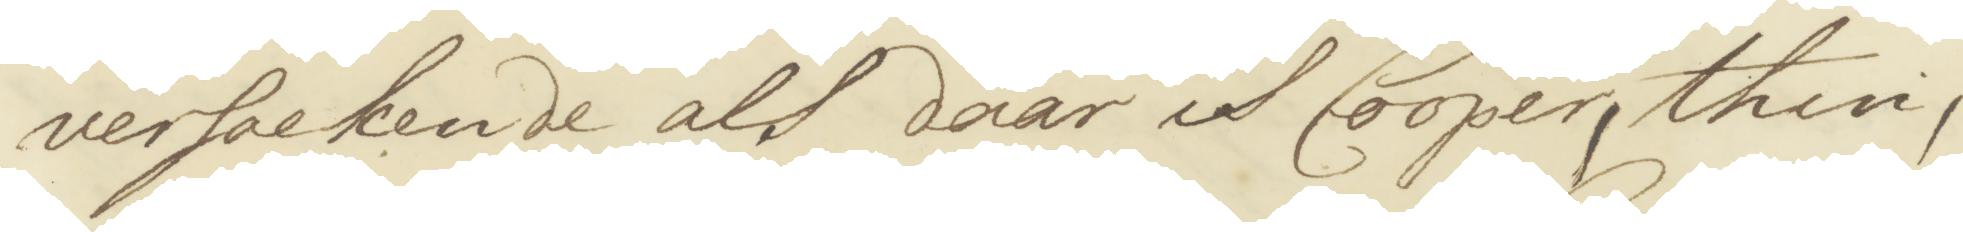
versoekende als daar is Cooper, thin,
